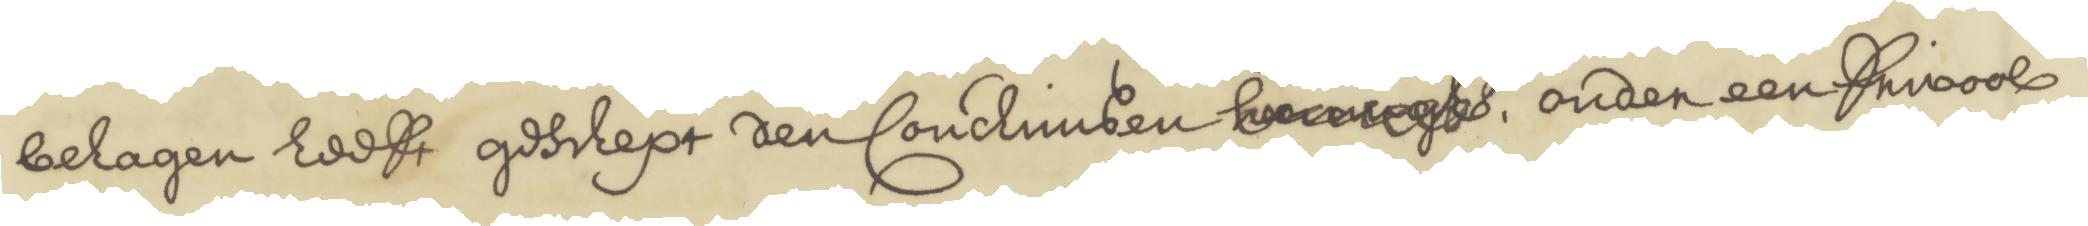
behagen heeft geschept den Couchimsen koningh, onder een frivool
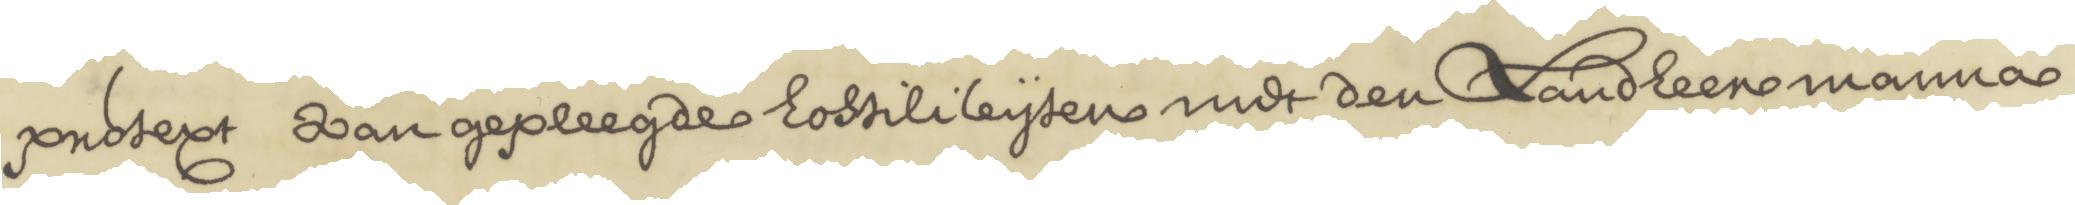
protext van gepleegde hostilileijten met den Landheer manna
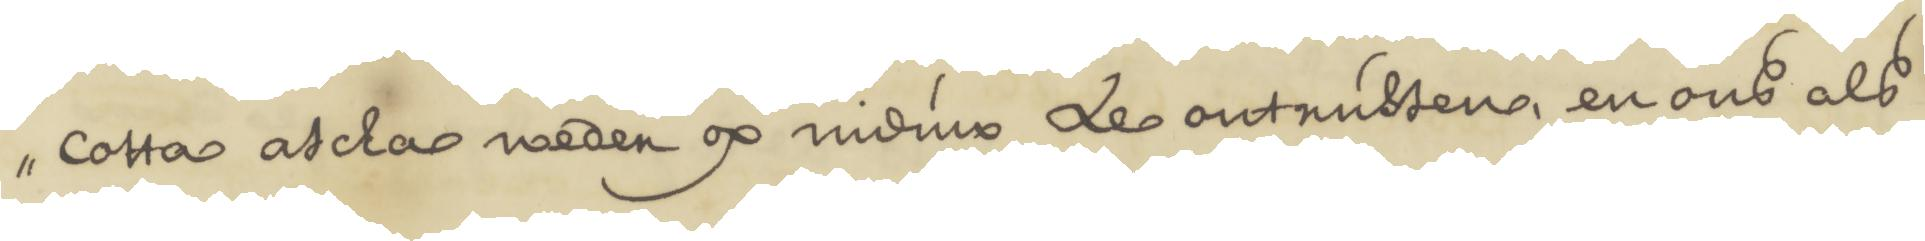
„cotta ascha weder op nieuw te ontrusten, en ons als
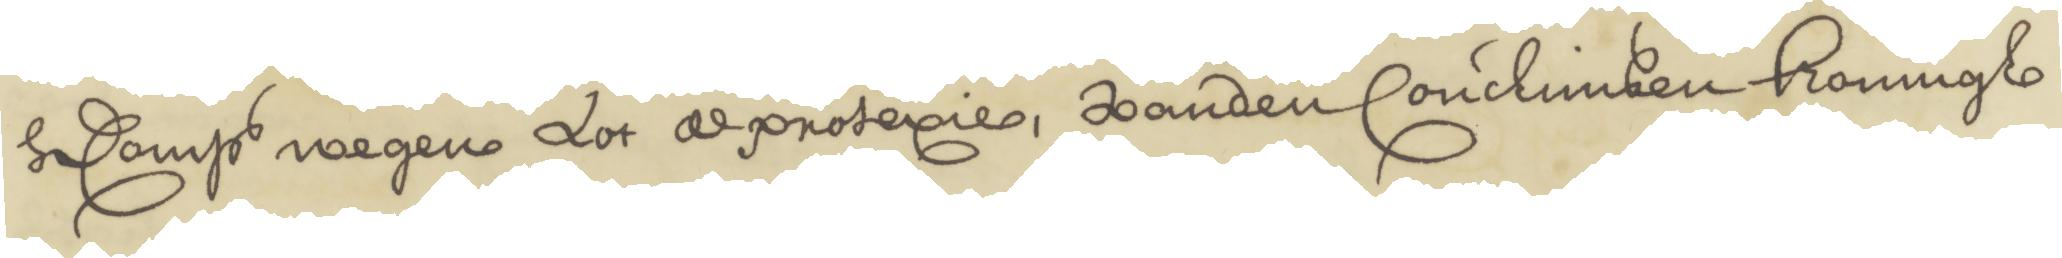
sComps wegens tot de protexie, vanden Couchimsen koningh
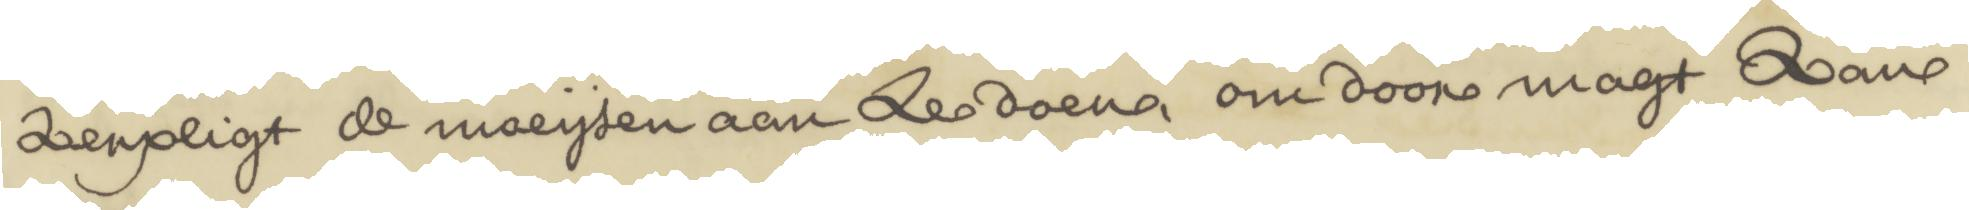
verpligt de moeijten aan te doen, om door magt van
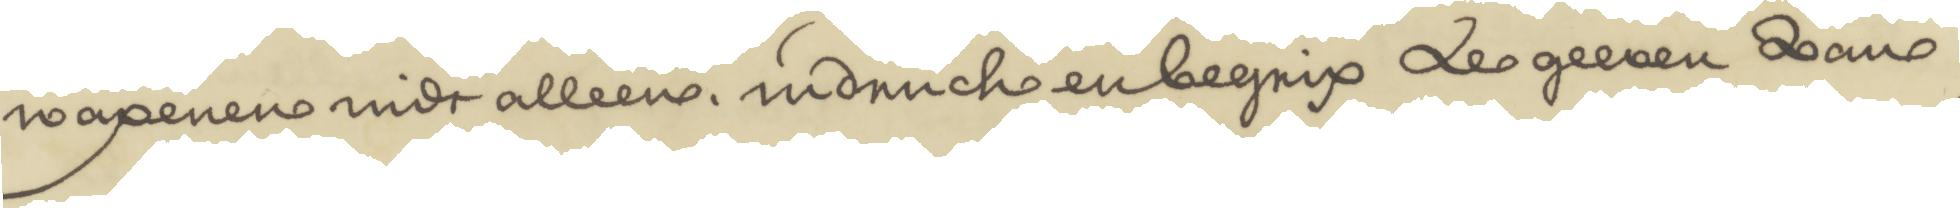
wapenen niet alleen, indruck en begrip te geeven van
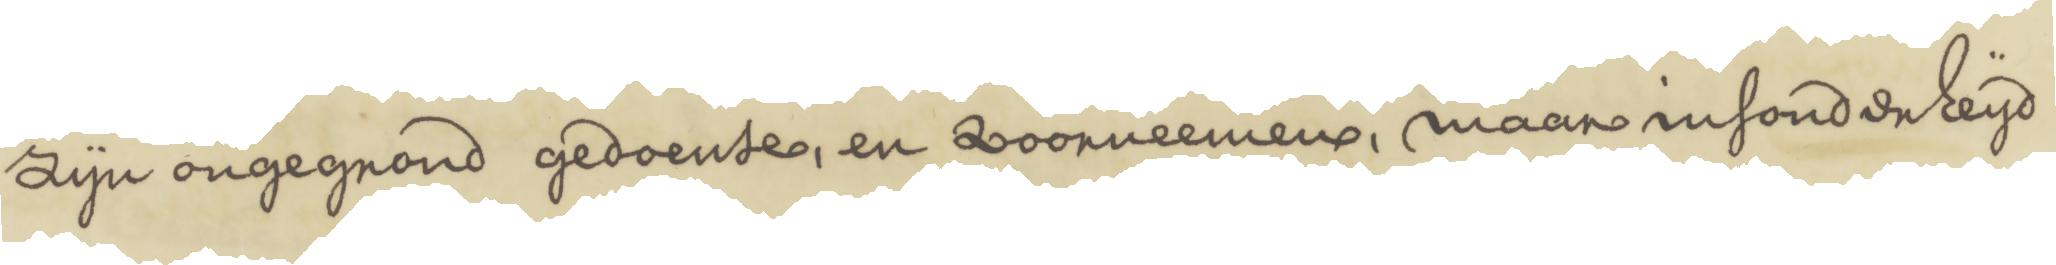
zijn ongegrond gedoente, en voorneemen, maar insonderheijd
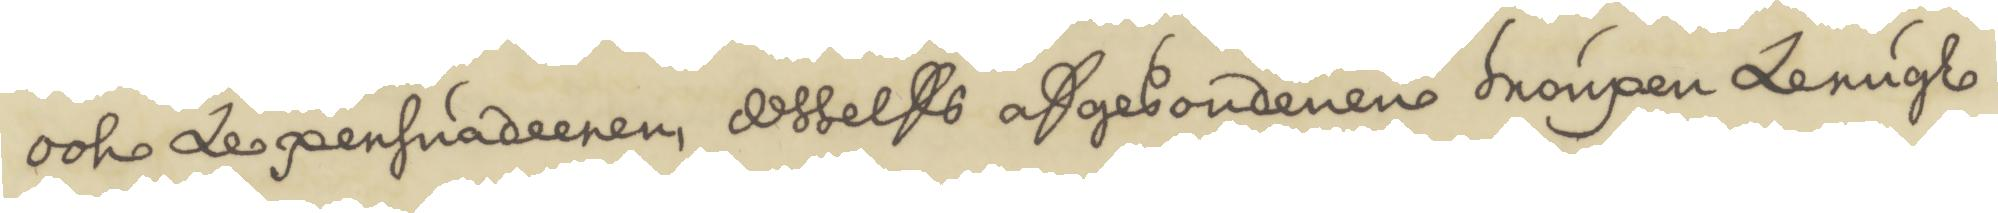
ook te persuadeeren, desselfs afgesondenen troupen terugh
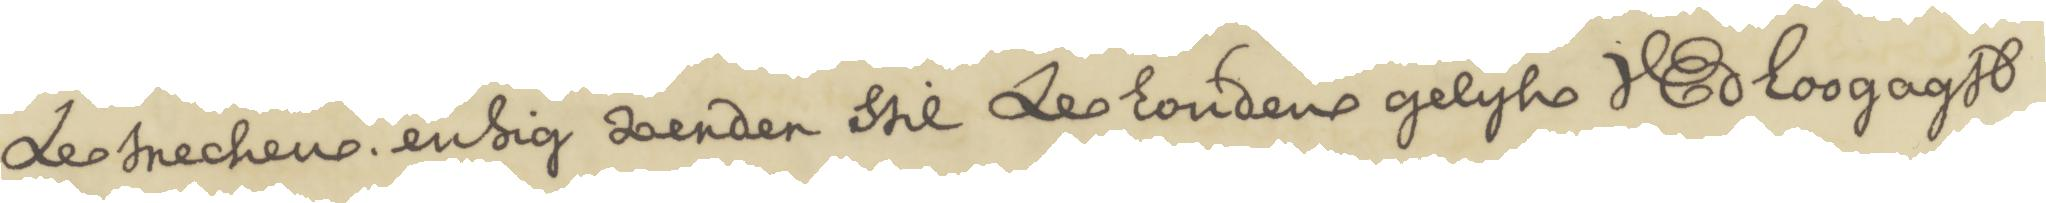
te trecken, en sig verder stil te houden gelijk VEd hoogagtb
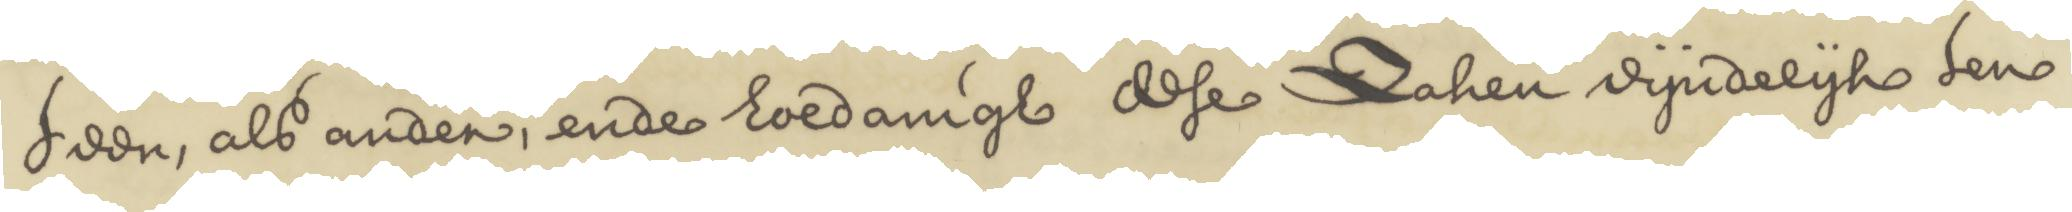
t een, als ander, ende hoedanigh dese zaken eijndelijk ten
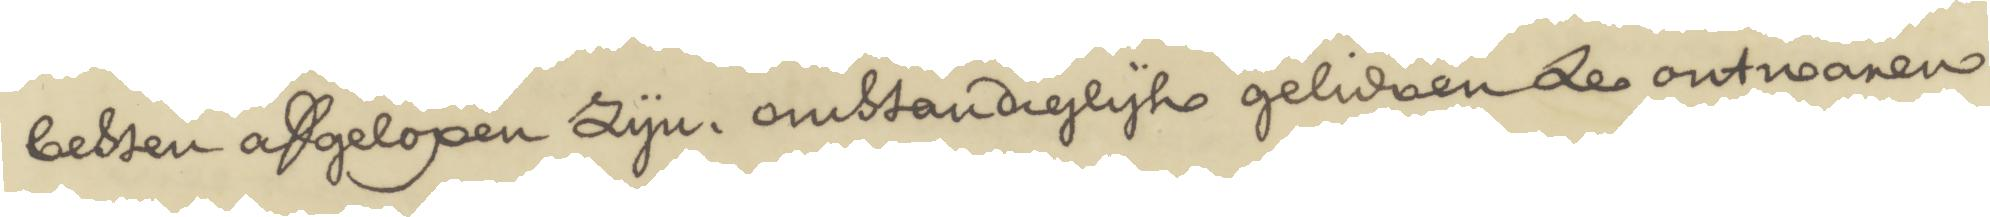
besten afgelopen zijn, omstandiglijk gelieven te ontwaren
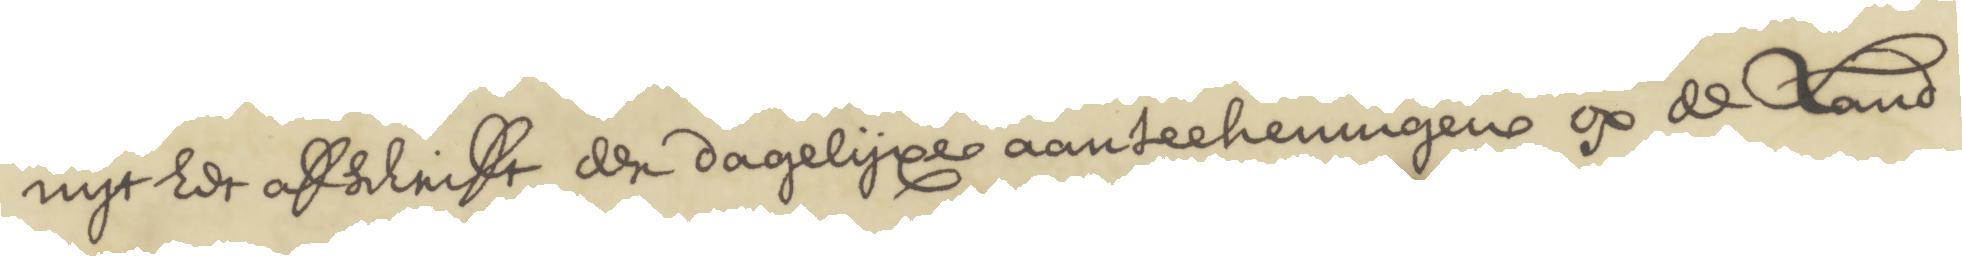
uijt het afschrift der dagelijxe aanteekeningen op de Land
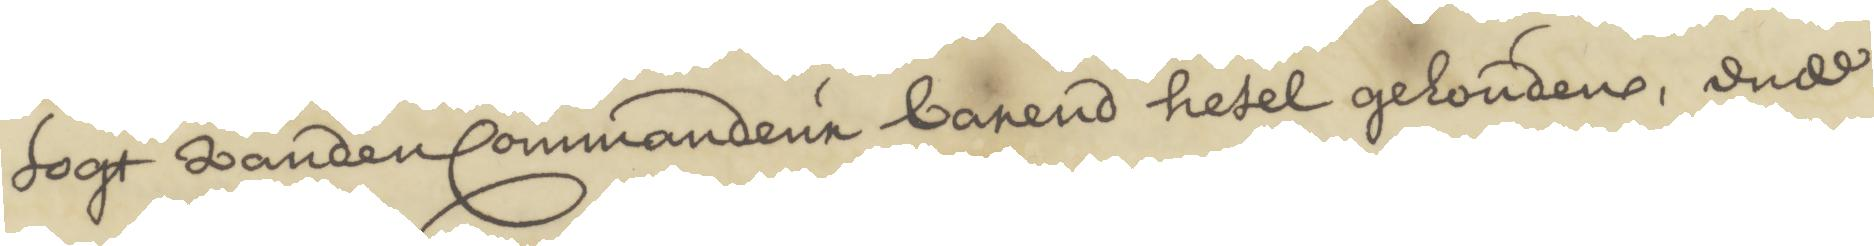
togt vanden Commandeur barend ketel gehouden, ende
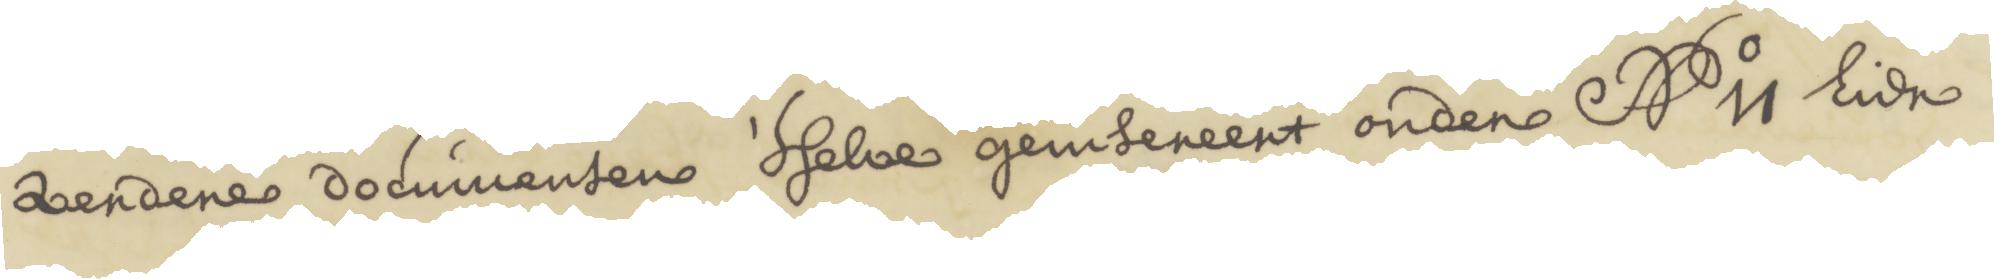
verdere documenten 'tselve geinsereert onder No 11 hier
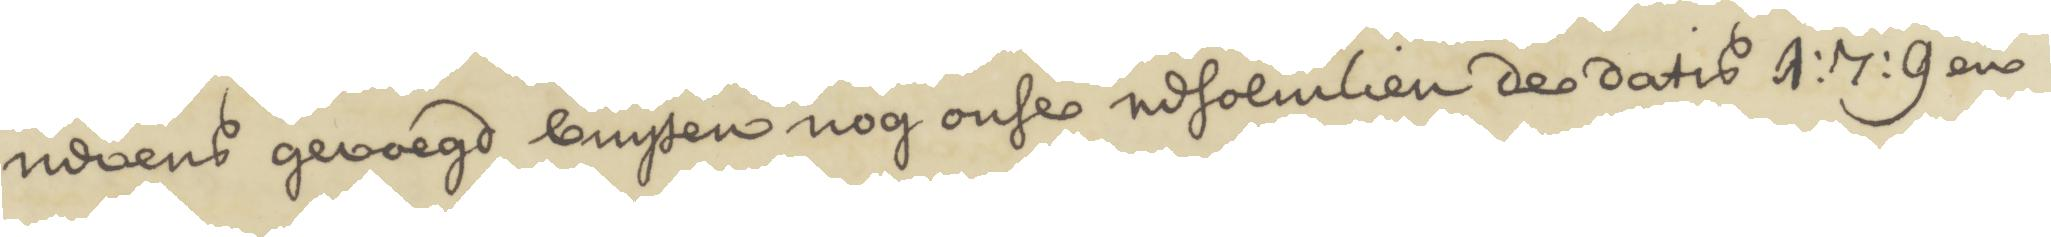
nevens gevoegd buijten nog onse resolutien de datis 4:7:9 en
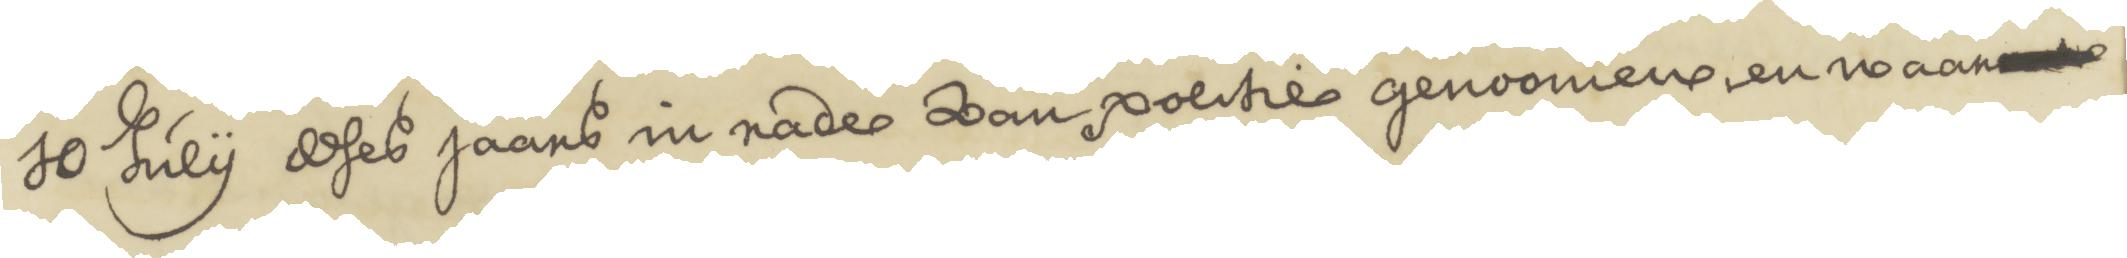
10 Iulij deses jaars in rade van politie genoomen, en waaraan
